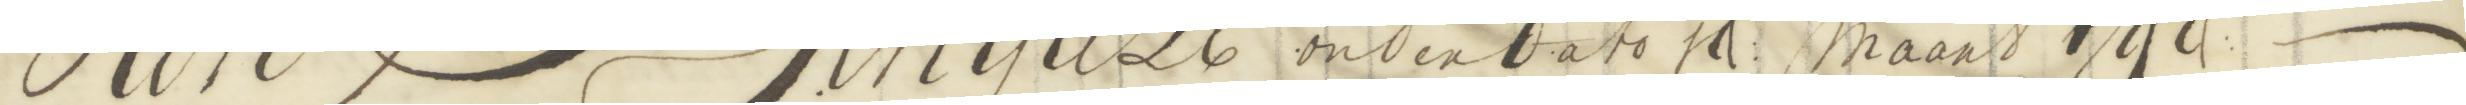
Van Bengale onder dato 14:' Maart 1744: —
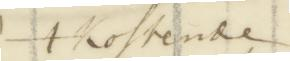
't kostende
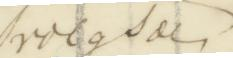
volg:s de
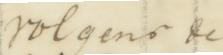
volgens de
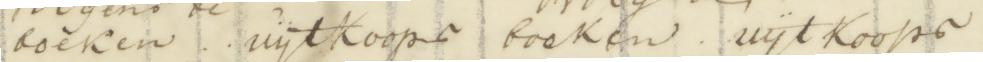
boeken uijtkoops boeken uijtkoops
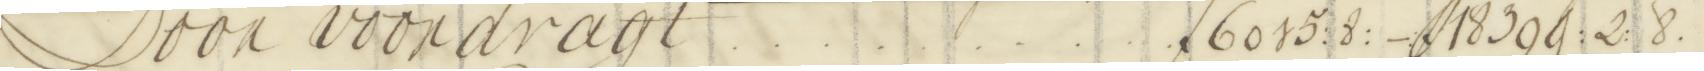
Door voordragt ƒ 6015: 8: — ƒ 18394: 2: 8.
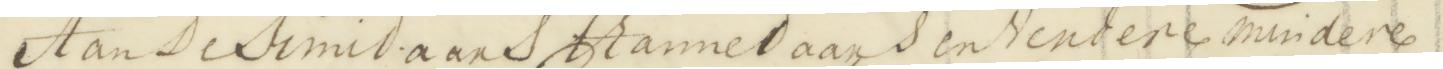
Aan De Simidaars thannedaars en verdere mindere
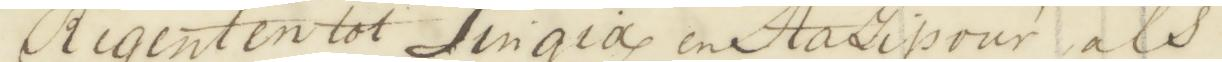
Regenten tot Lingia en Hazipour, als
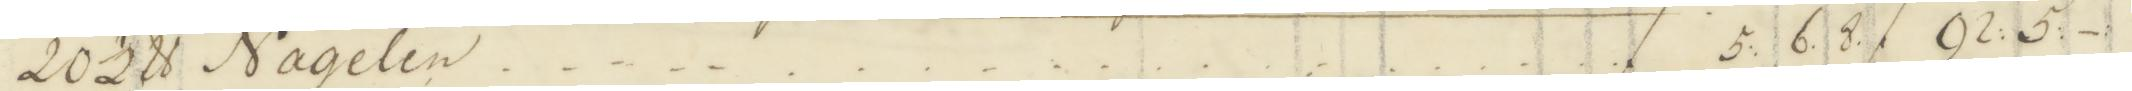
20½ lb Nagelen . . . . . . . . . . . . . . . . . . . ƒ 5: 6: 8. ƒ 92: 5: —:
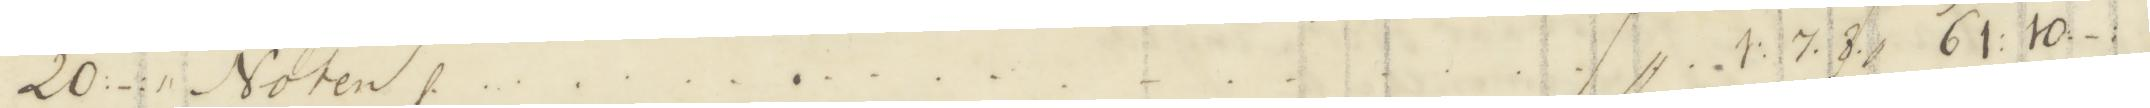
20: —: „ Noten . . . . . . . . . . . . . . . . . . . „ 1: 7: 8. „ 61: 10: —:
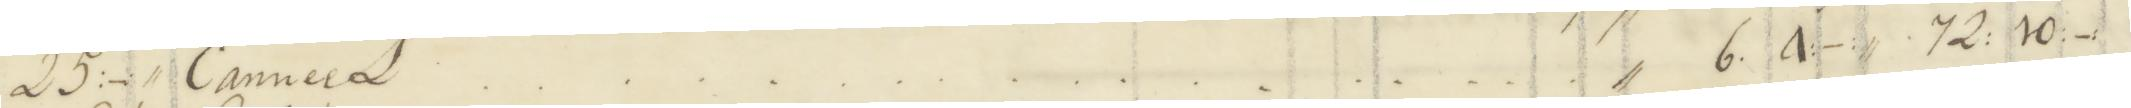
25: —: „ Canneel . . . . . . . . . . . . . . . . . . . „ 6. 4: —: „ 72: 10: —:
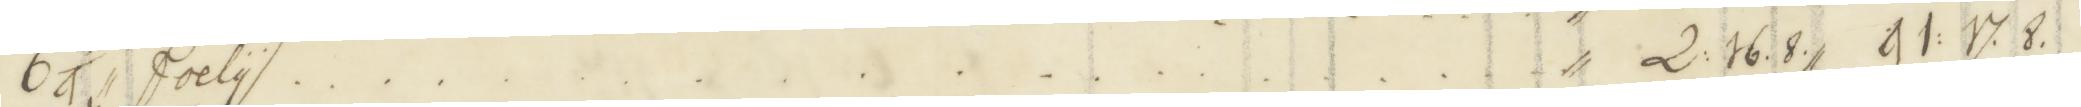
6 1/4 „ foelij . . . . . . . . . . . . . . . . . . „ 2: 16: 8: „ 41: 17: 8.
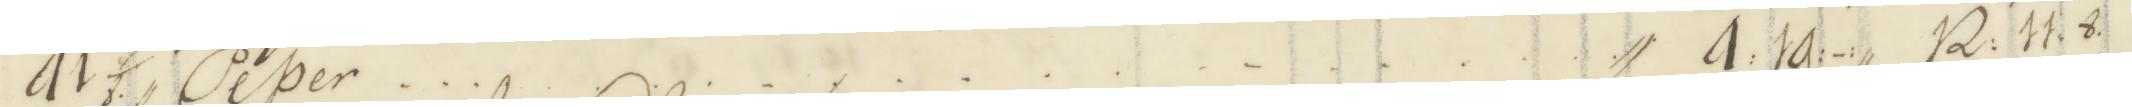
41 7/8 „ Peper . . . . . . . . . . . . . . . . . . . . . . . . „ 4: 14: —: „ 12: 11: 8.
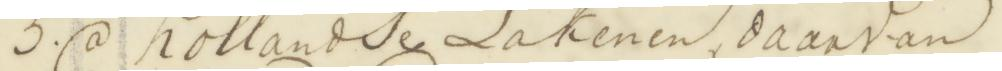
5. @ hollandse Lakenen daar van
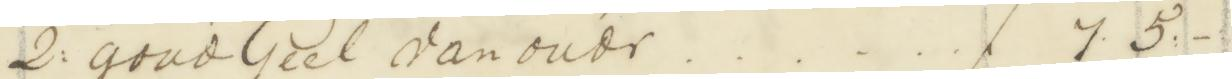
2: goud Geel van ouds . . . . . . ƒ 7: 5: —:
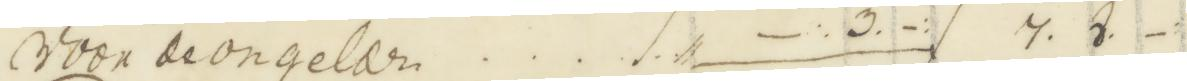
voor de ongelden . . . . . „ —: 3. —: ƒ 7: 8: —:
